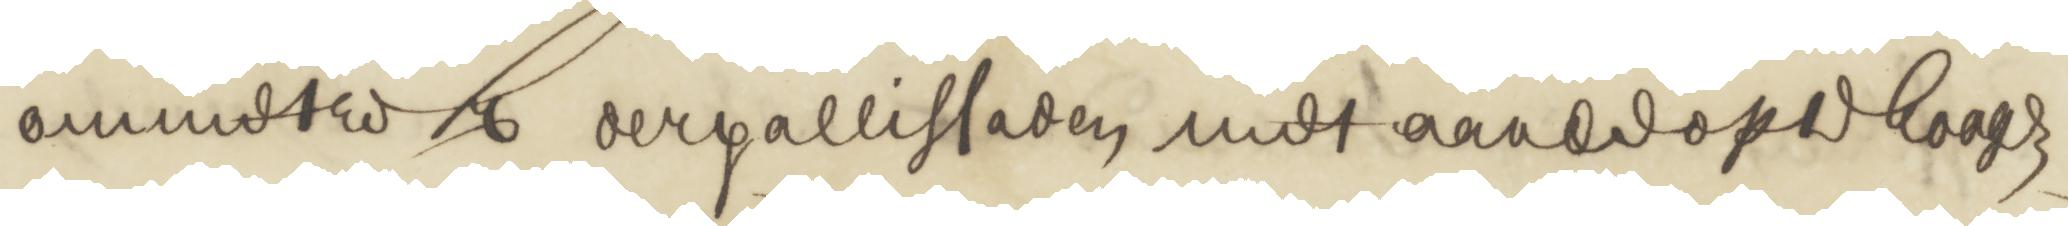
ommetrek der pallissaden met aarde op tehoogen
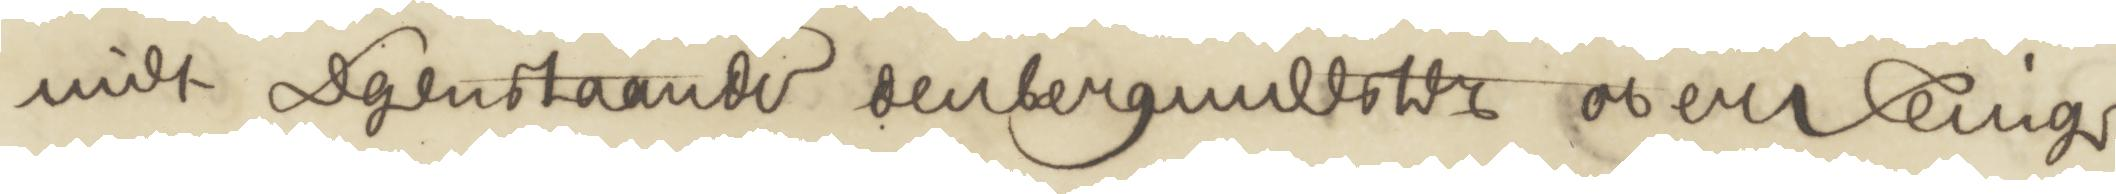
niet tegenstaande den bergmeester over Eenige
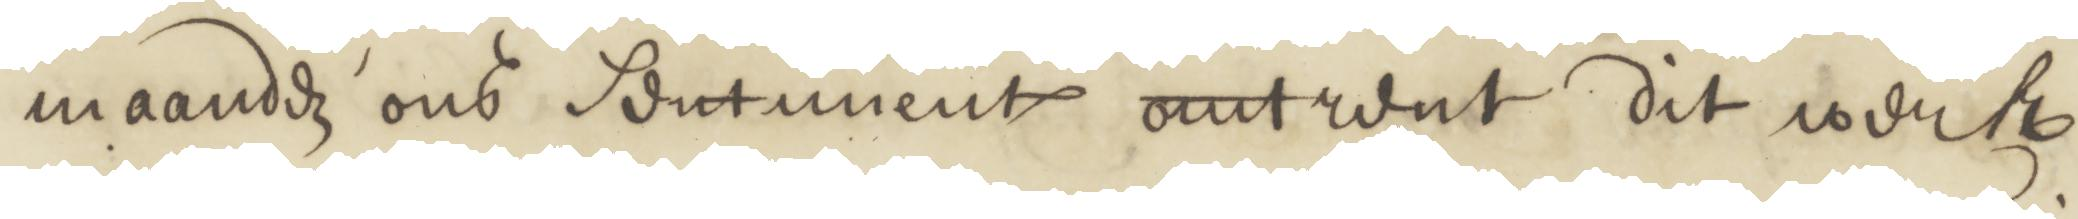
maanden ons sentiment omtrent dit werk
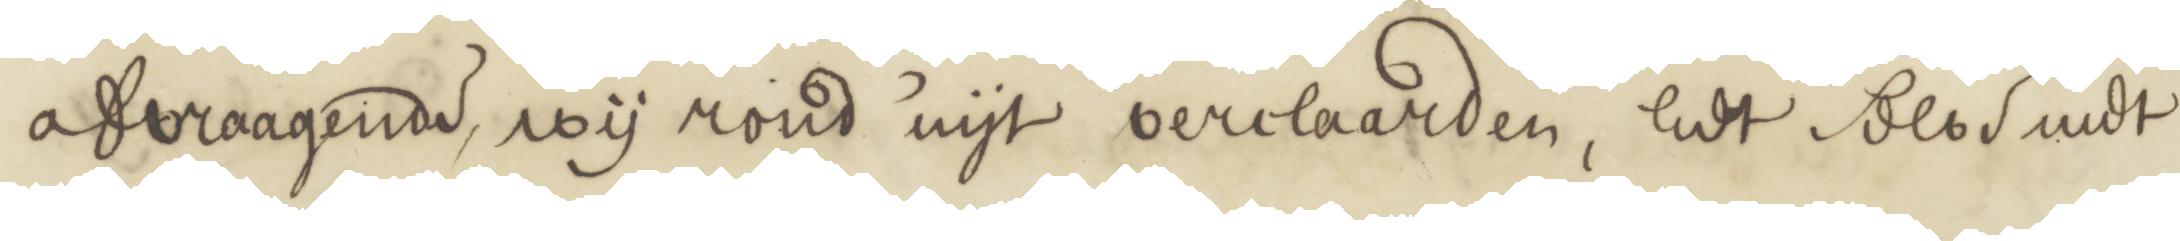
afvraagende, wij rond uijt verclaarden, het selve niet
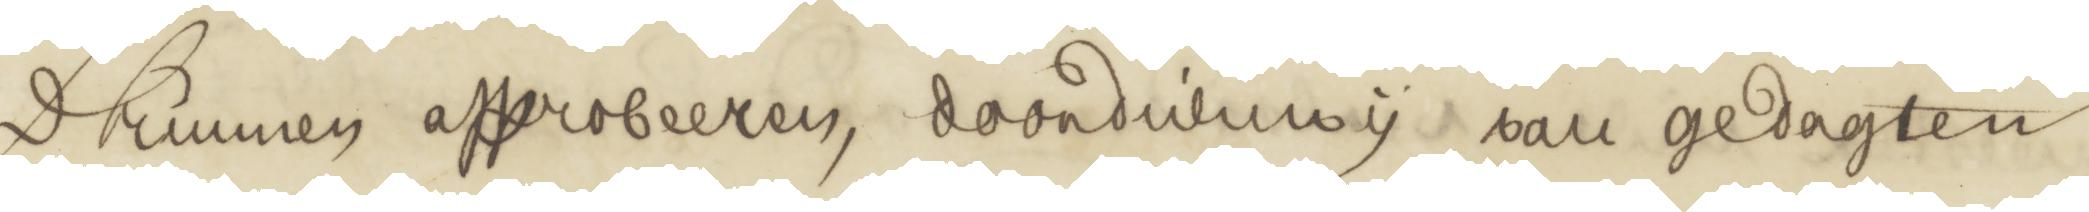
te kunnen approbeeren, doordien wij van gedagten
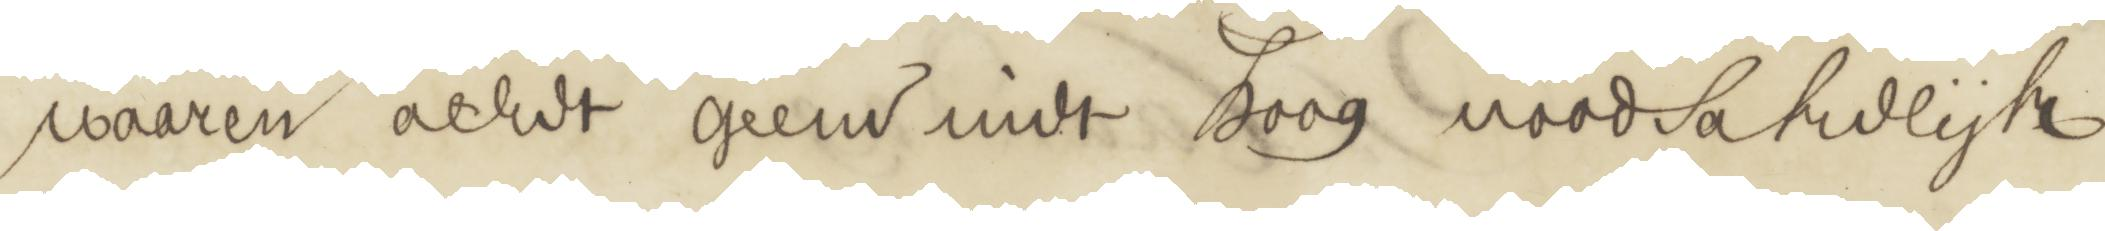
waaren alhet geene niet hoog noodsakelijk
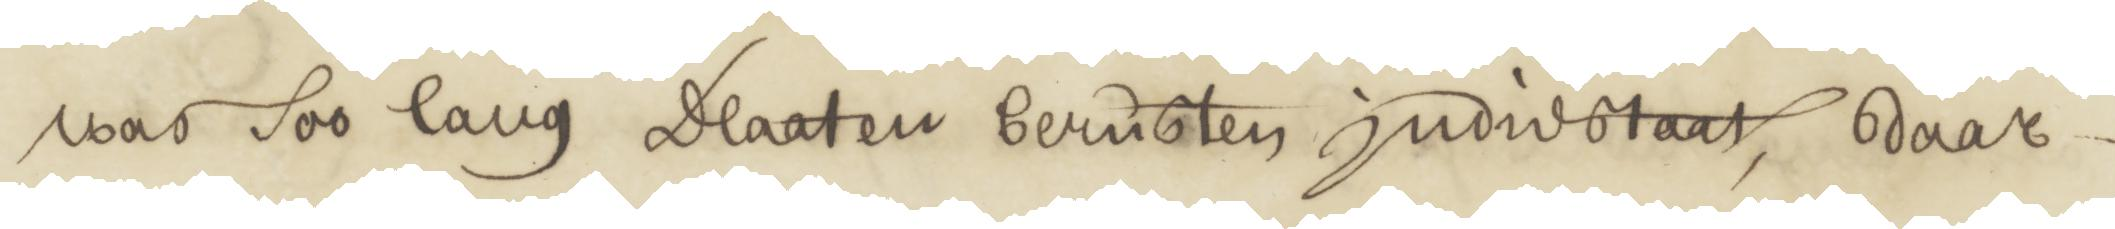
was Soo lang telaaten berusten jn die staat, daar
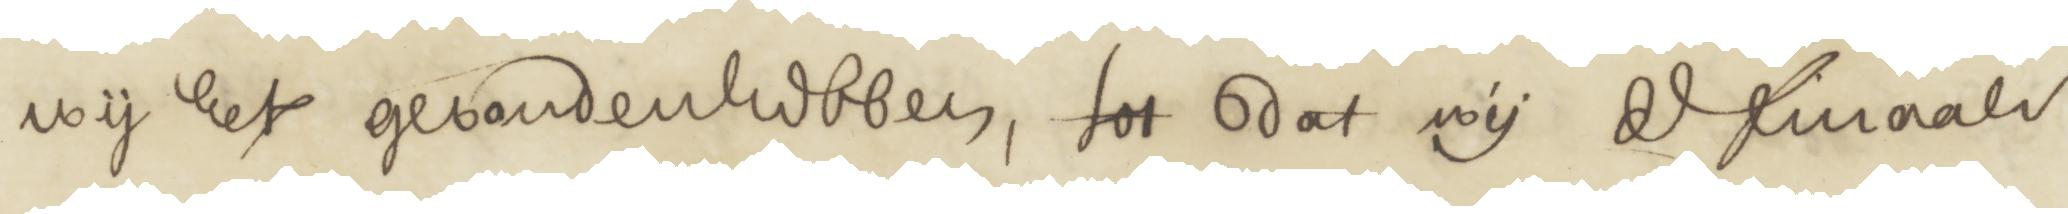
wij het gevonden hebben, tot dat wij de finaale
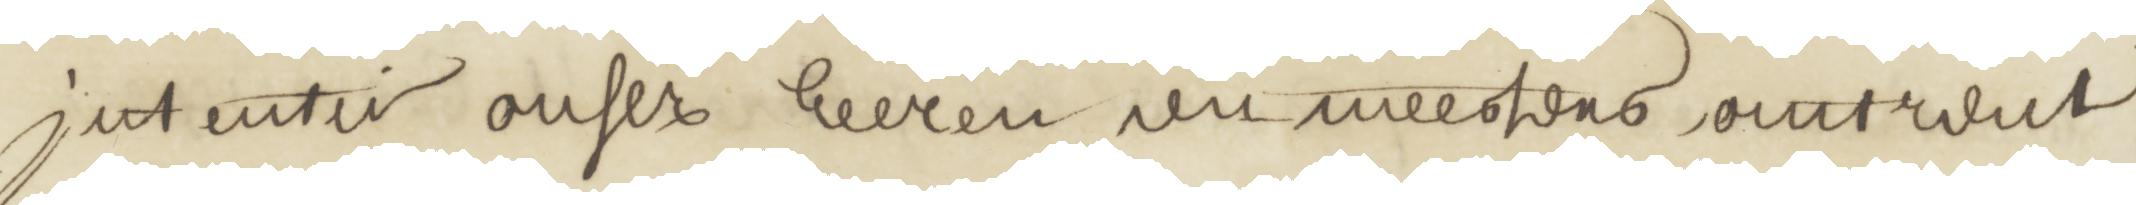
jntentie onser heeren en meesters, omtrent
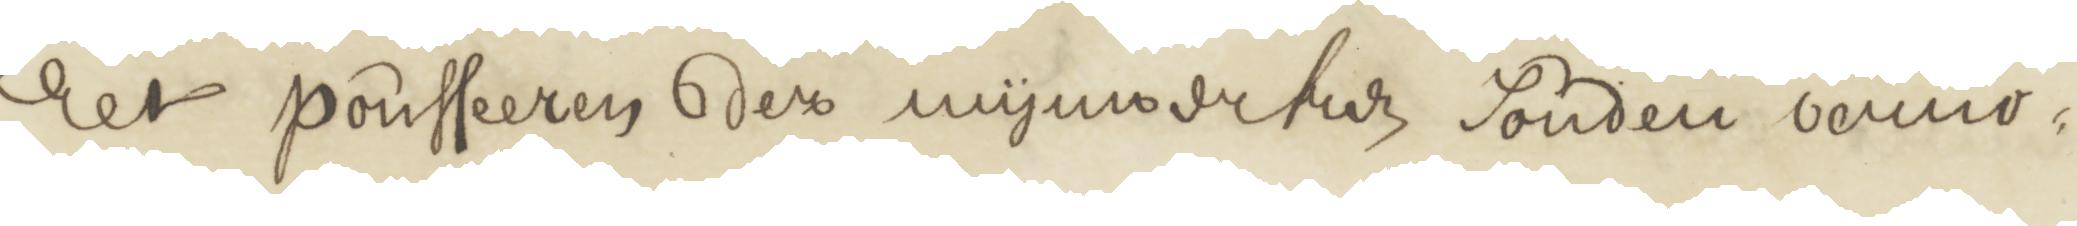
het pousseeren der mijnwerken Souden verno„
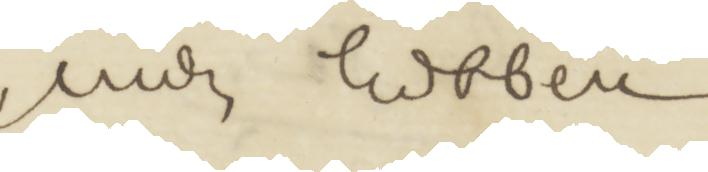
men hebben
